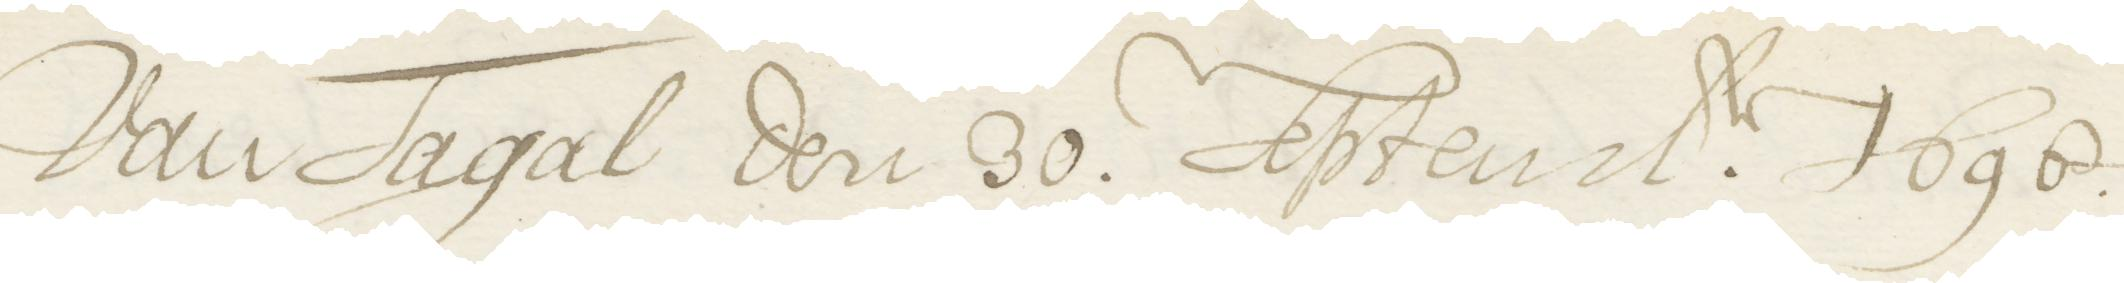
Van Tagal den 30. Septemb.r 1696.
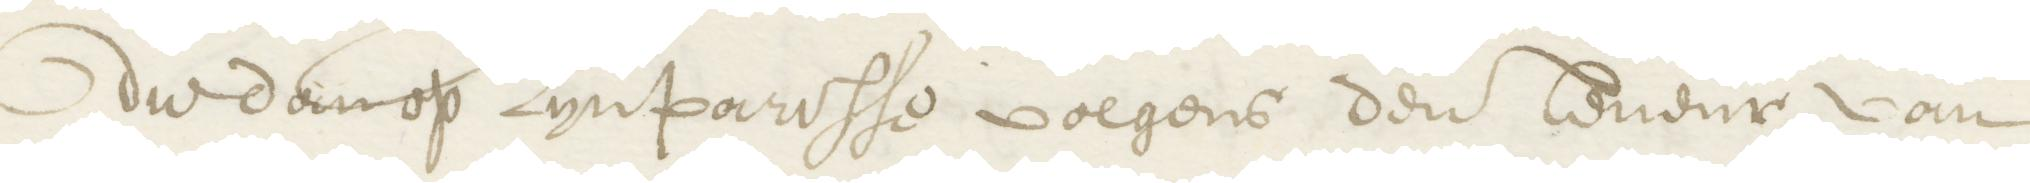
die dan op zijn paresse volgens den Teneur van
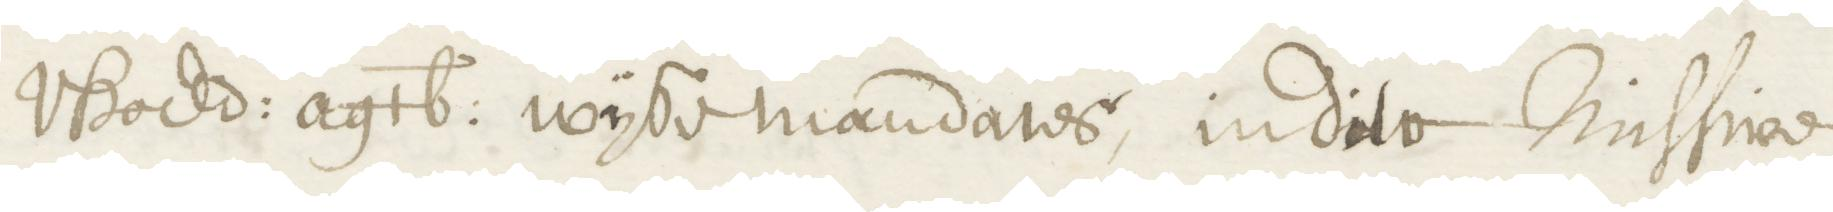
VHoEd: agtb: wijse mandates, in dito Missive
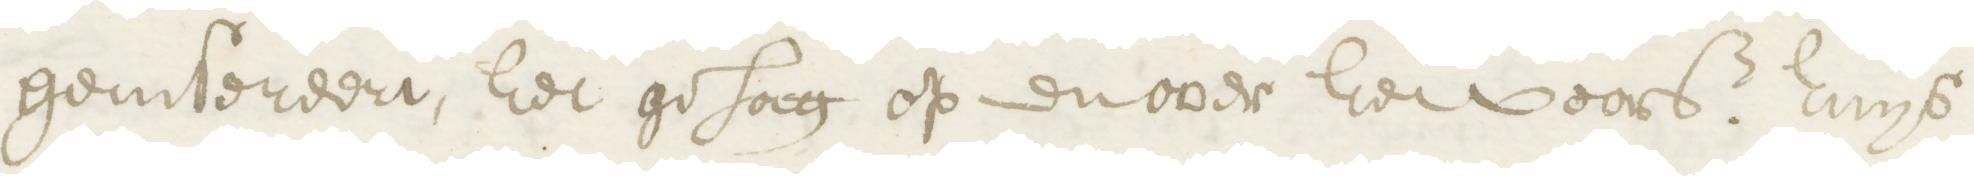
geinsereert, het gesag op en over het voors: huijs
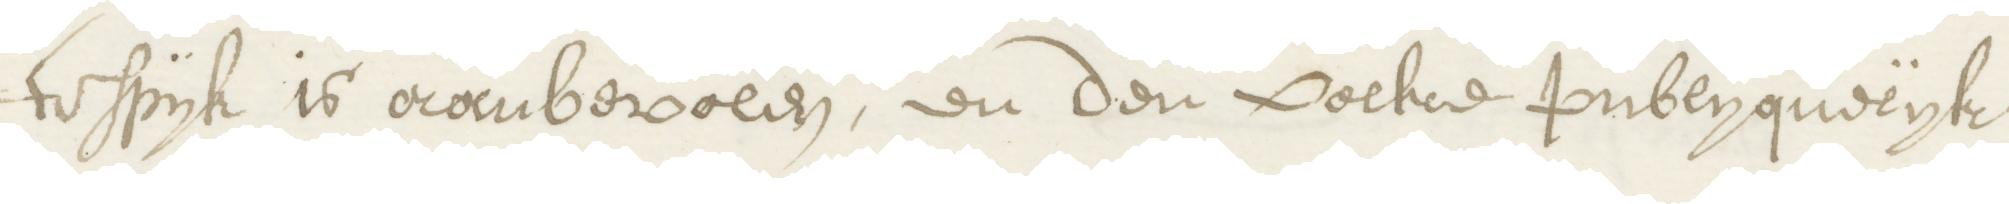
tespijk is aanbevolen, en den volke publijquelijk
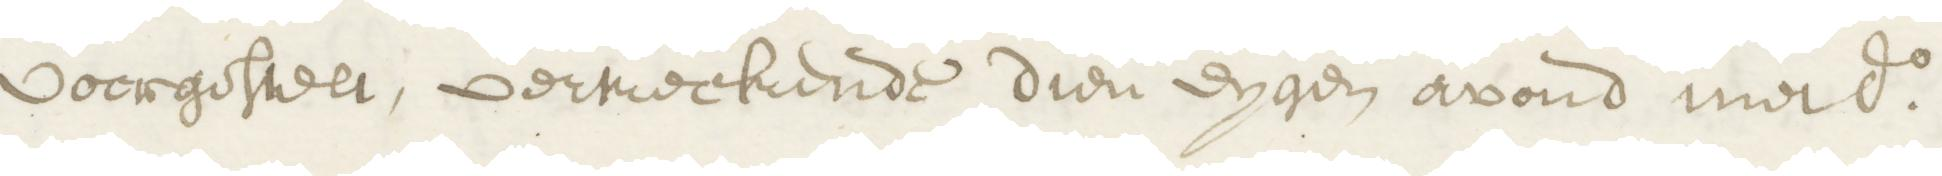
voorgestelt, vertreckende dien eijgen avond met d.o
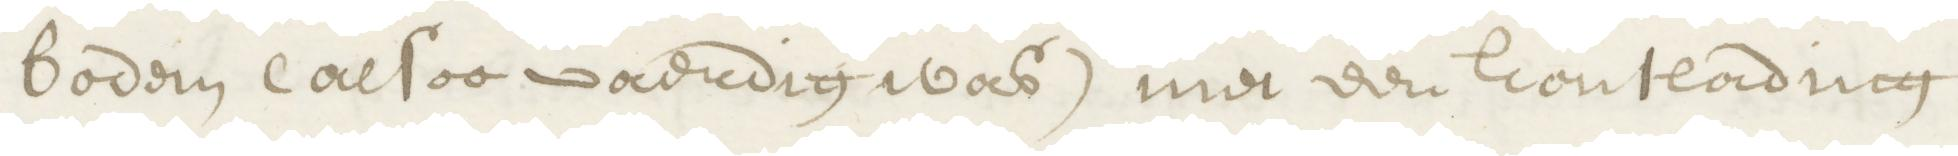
bodem (alsoo vaerdig was) met een houtlading
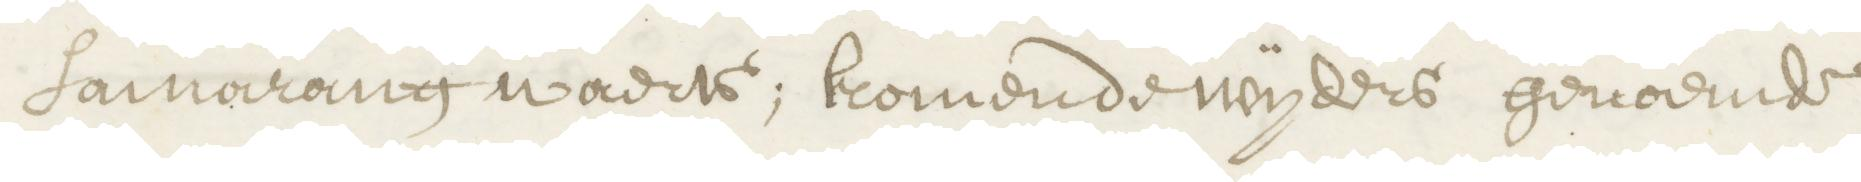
samarang waerts; komende wijders genoemde
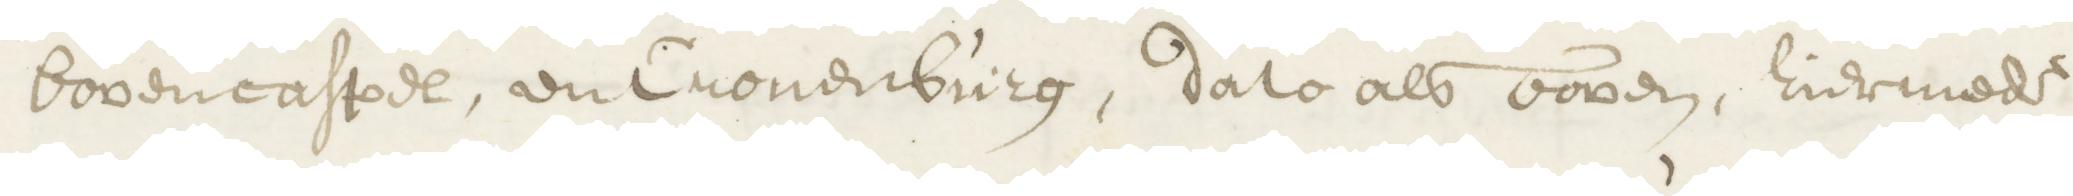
bovencaspel, en Cronenburg, dato als boven, hiermede
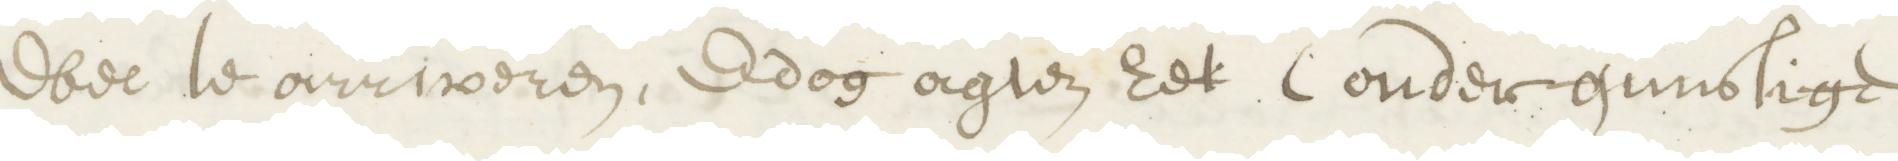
wel te arriveren, Edog agten het (onder gunstige
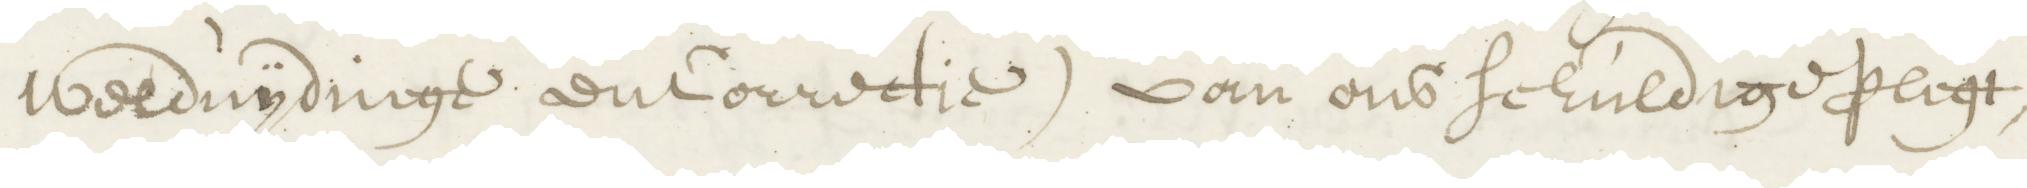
welduijdinge en correctie) van ons schuldige pligt,
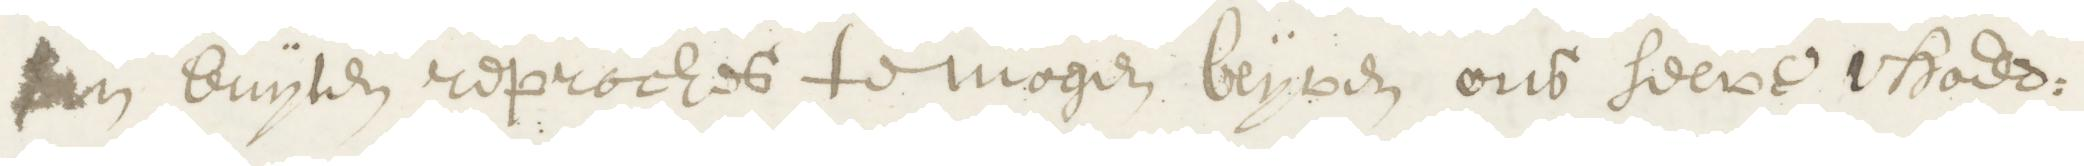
van buijten reproches te mogen blijven ons selve VHoEd:
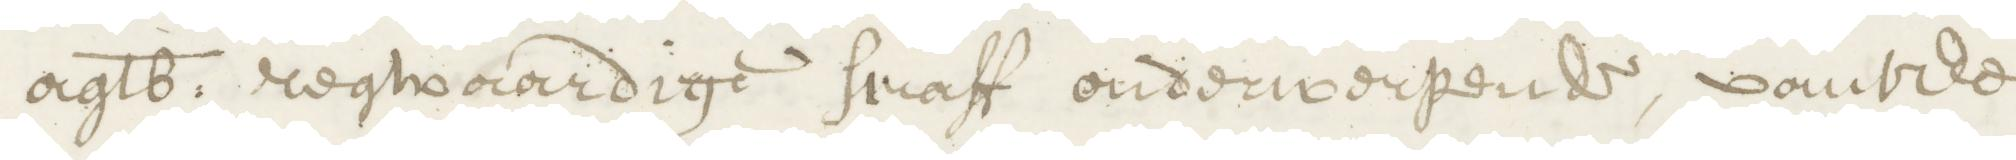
agtb: regtvaardige straff onderwerpende, van vEd
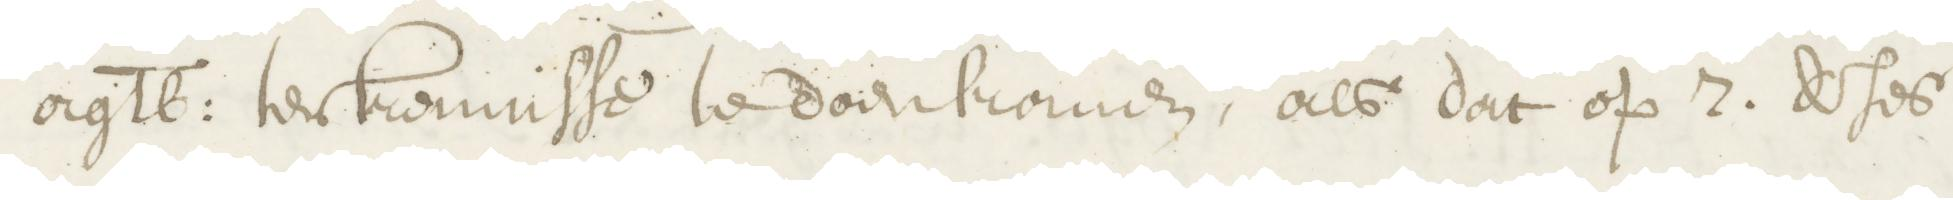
agtb: terkennisse tedoen komen, als dat op 7. deses
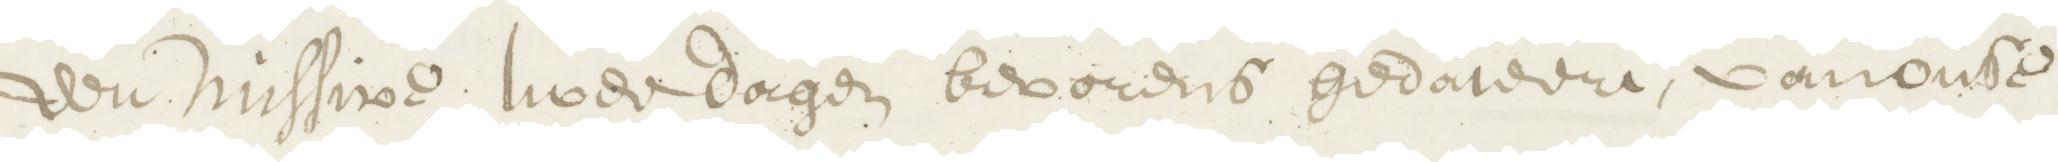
een missive twee dagen bevorens gedateert, van onse
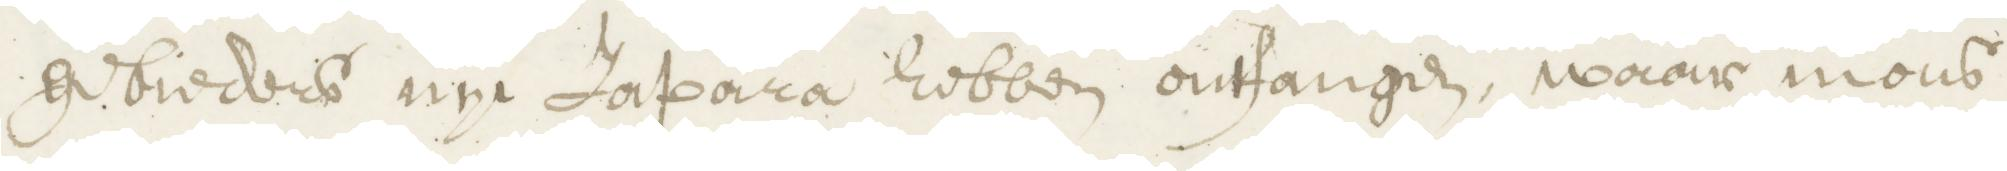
gebieders uijt Iapara hebben ontfangen, waar in ons
